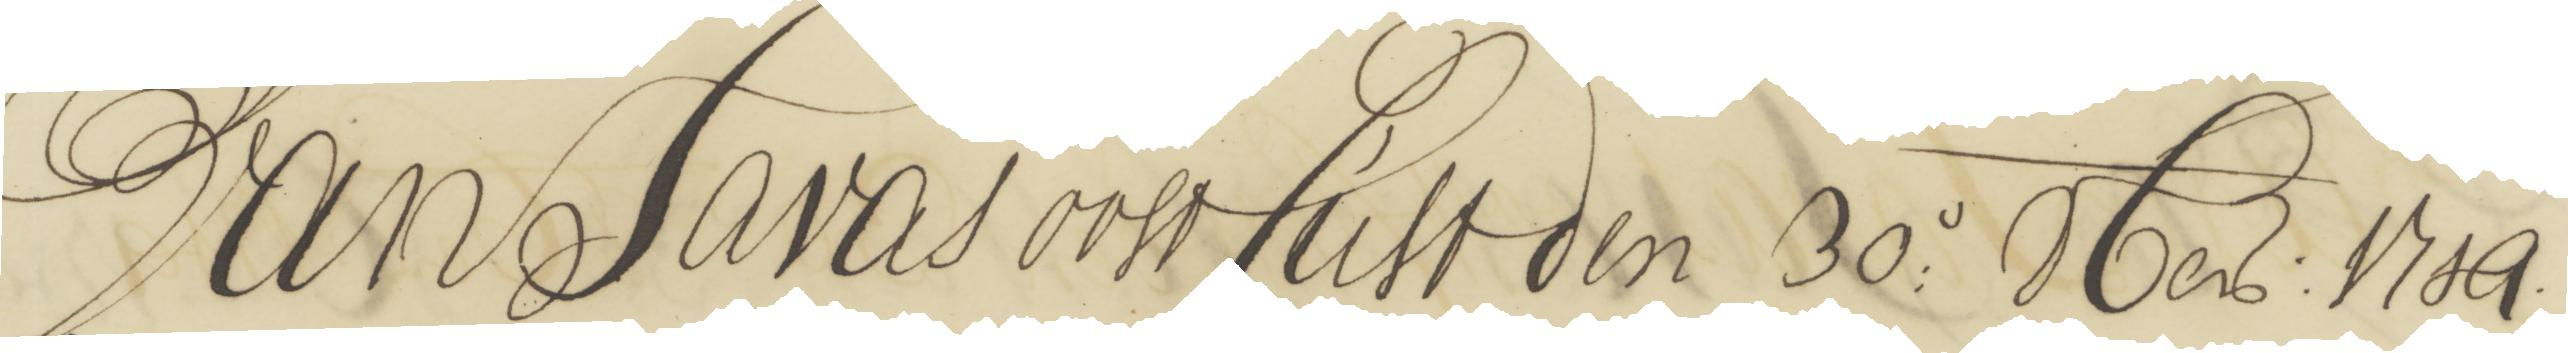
Van Javas oost Cust den 30:' 7ber: 1714.
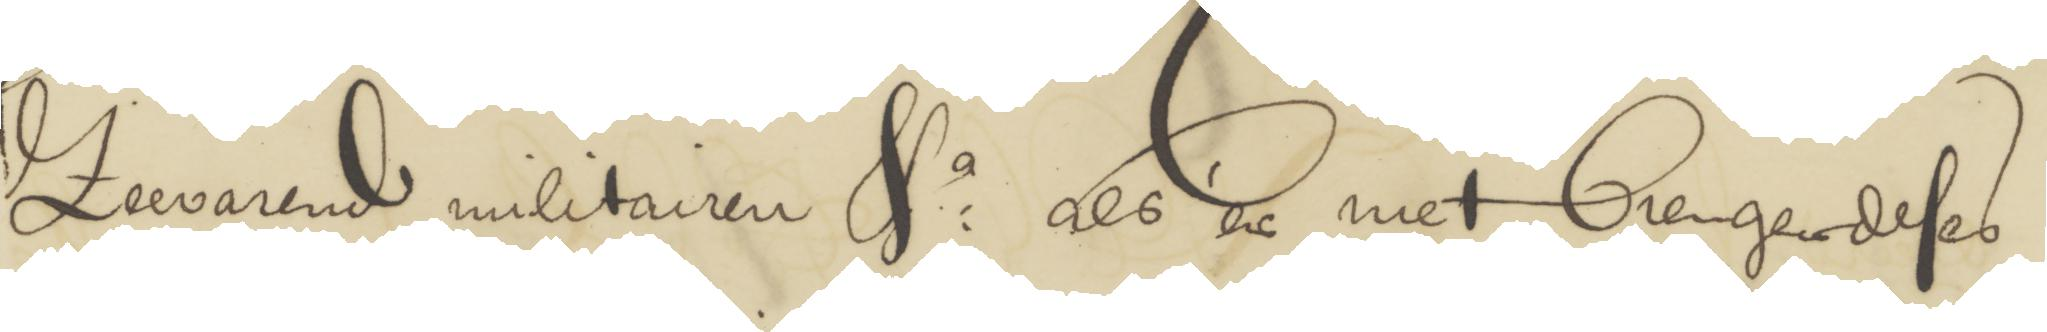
zeevarende militairen &:a als 'er met brenger deses
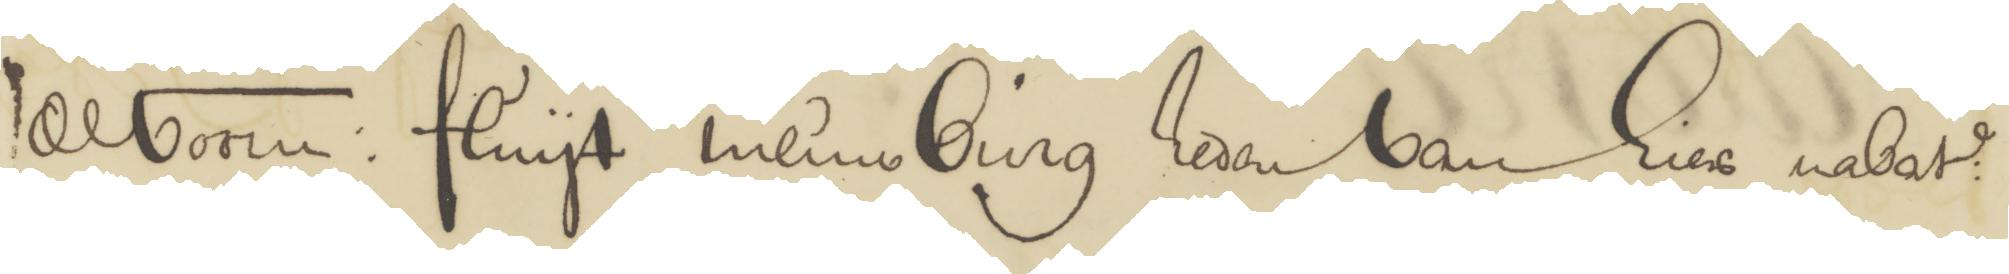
de voorn: fluijt nieuwburg hedan van hier na bat:a
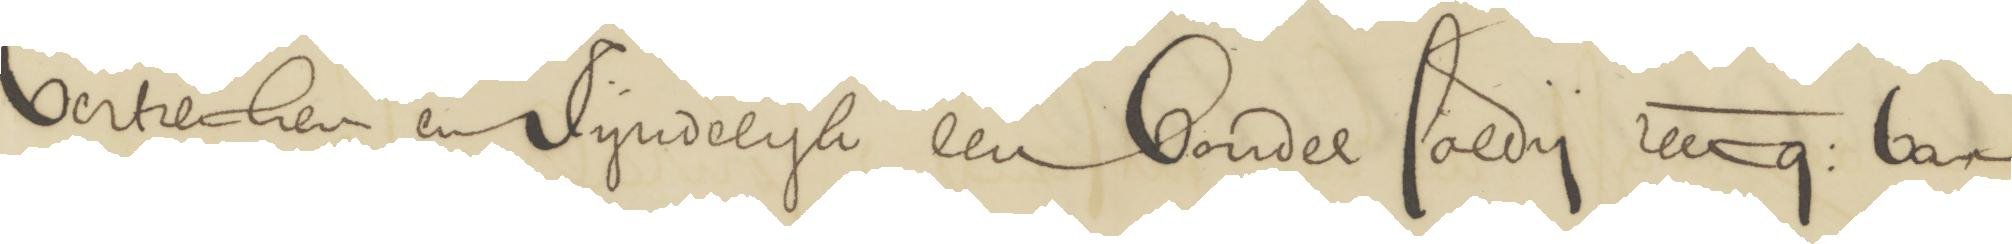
vertrecken en Eijndelijk een bondel soldij reecq: van
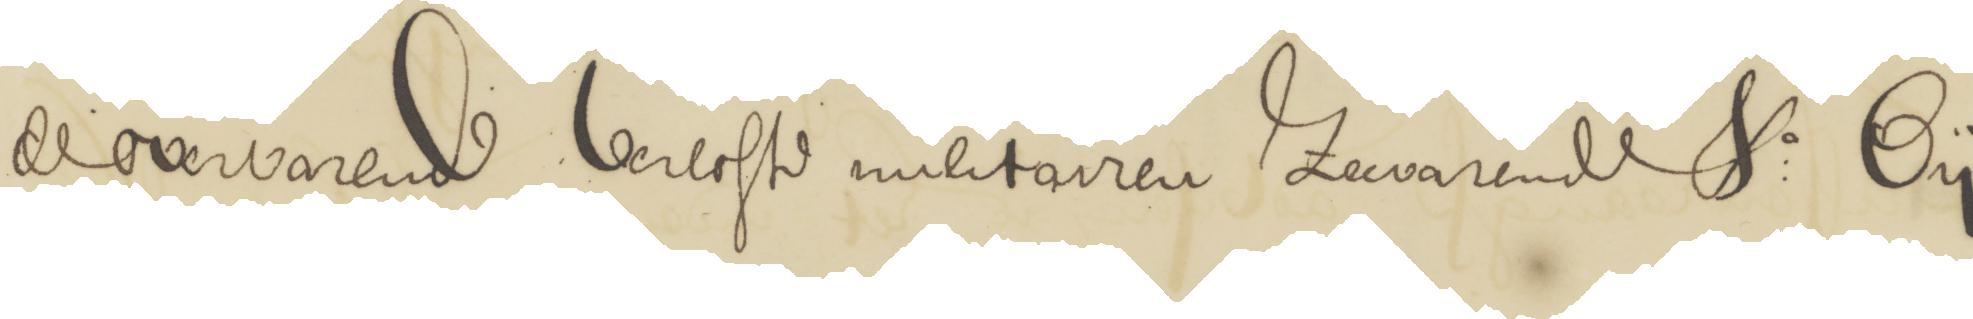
de overvarende verloste militairen zeevarende &:a bij
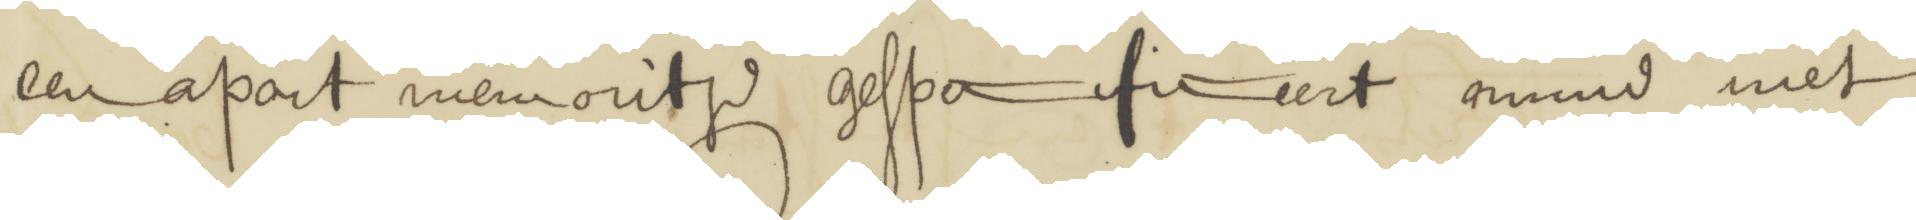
een apart memoritje gespecificeert omme met
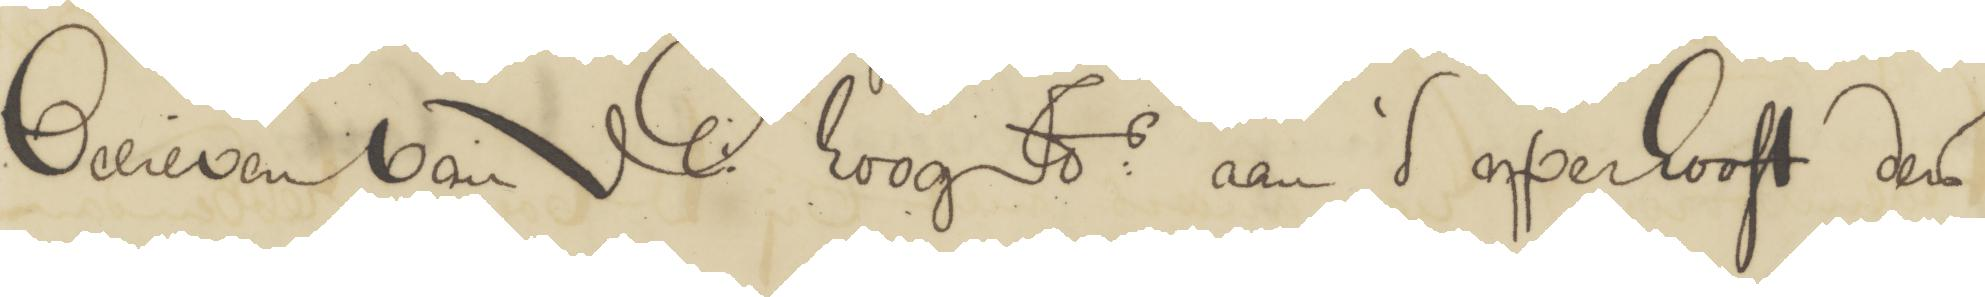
believen van VE: hoog Ed:s aan ’t opperhooft der
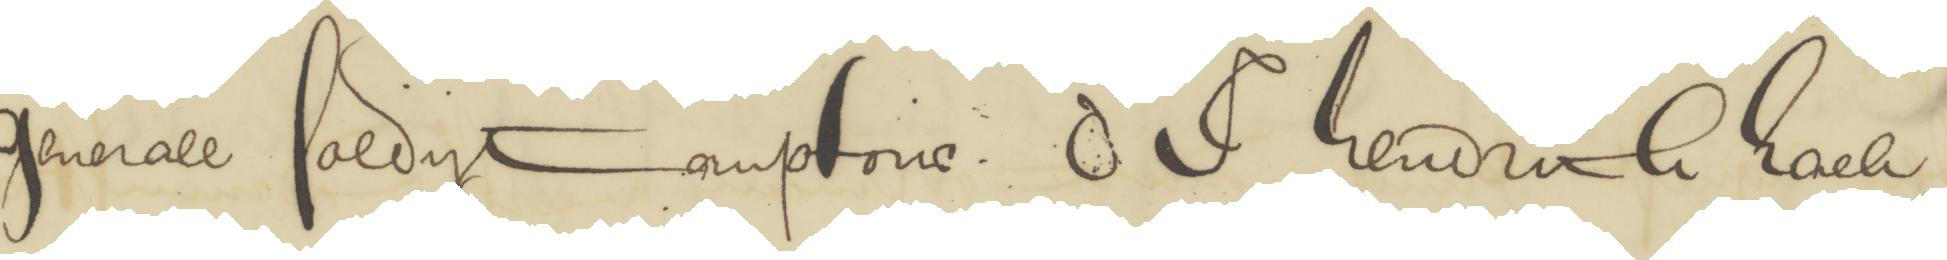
generale soldijcomptoir d' E hendrick haek
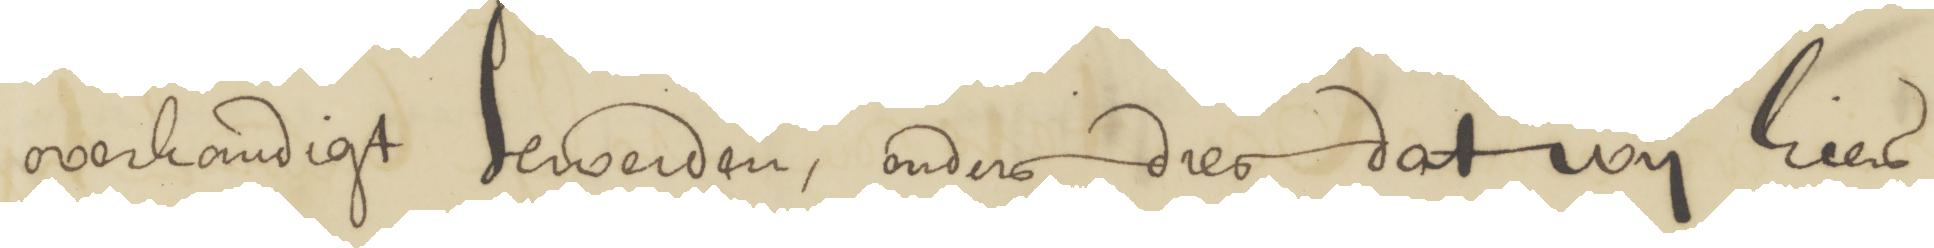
overhandigt tewerden, onder dies dat wij hier
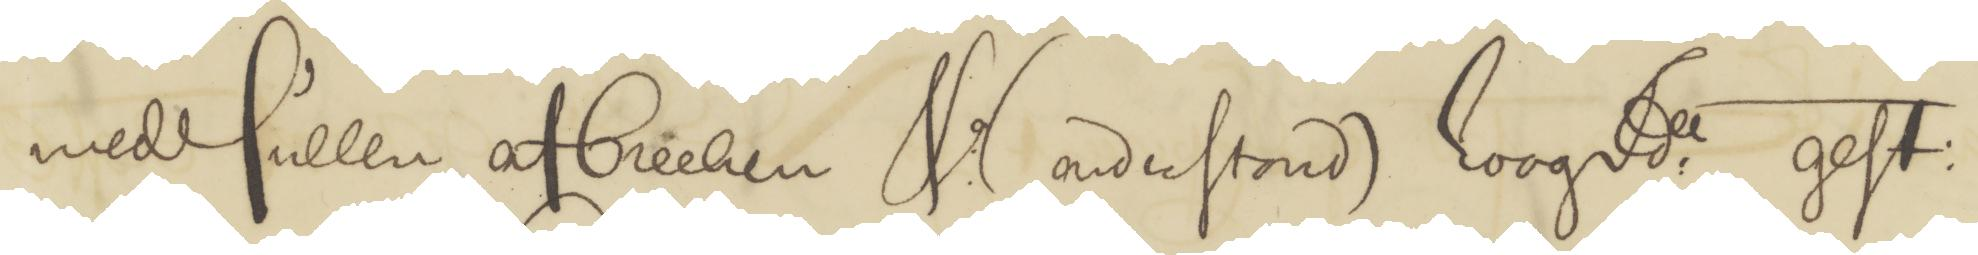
mede sullen afbreeken &:a (onderstond) hoog Ed:le gest:
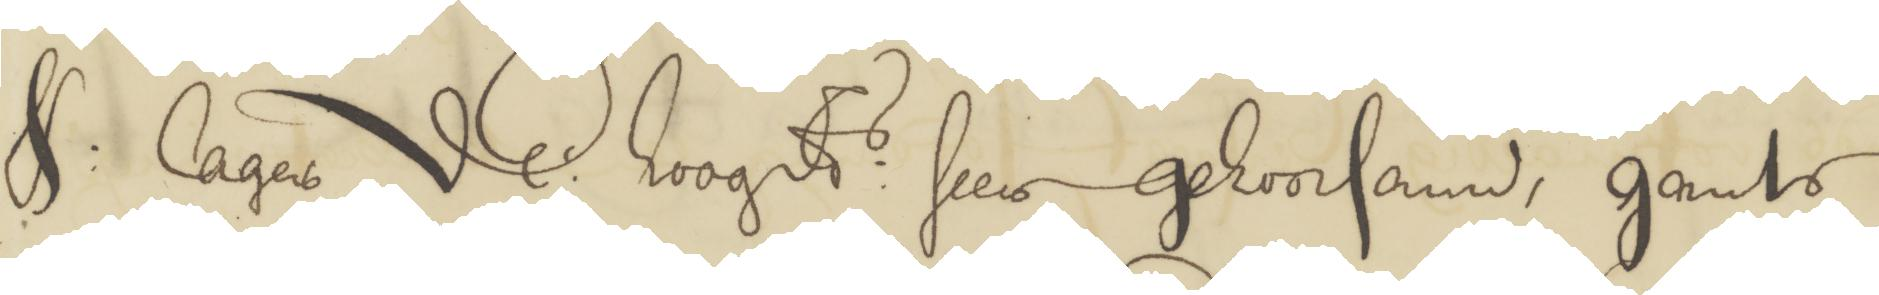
&: lager VE: hoog Ed:s seer gehoorsame, gants
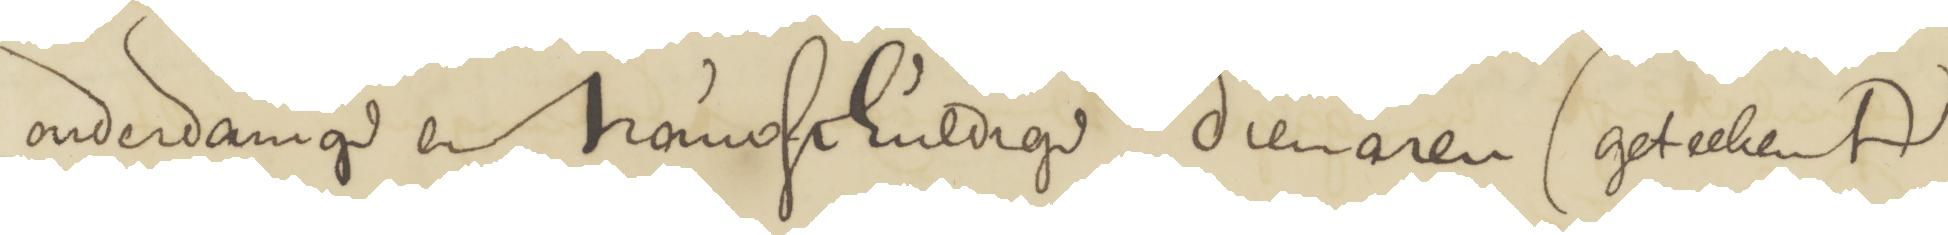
onderdanige en trouwschuldige dienaren (geteekent)
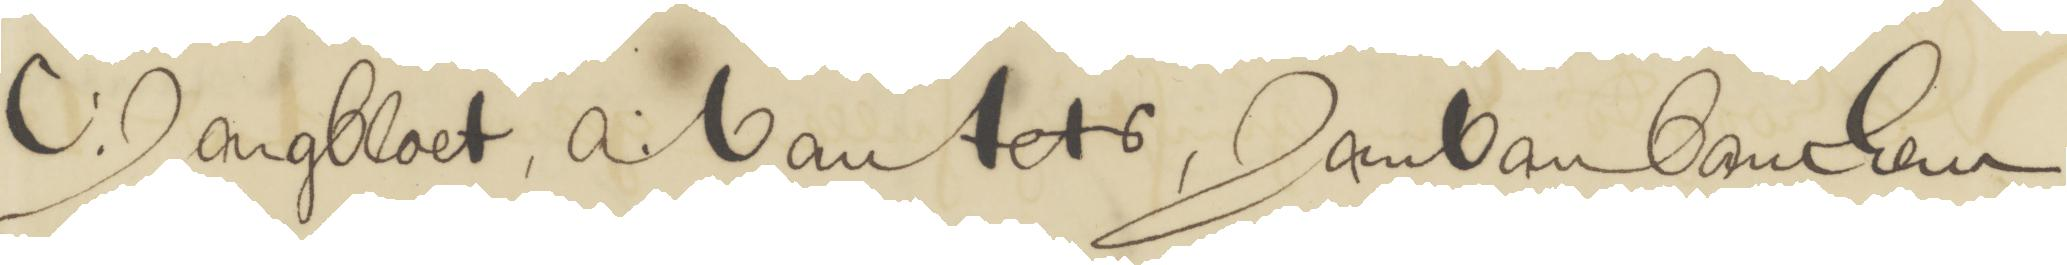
C: Jongbloet, a: van tets, Jan van banchem
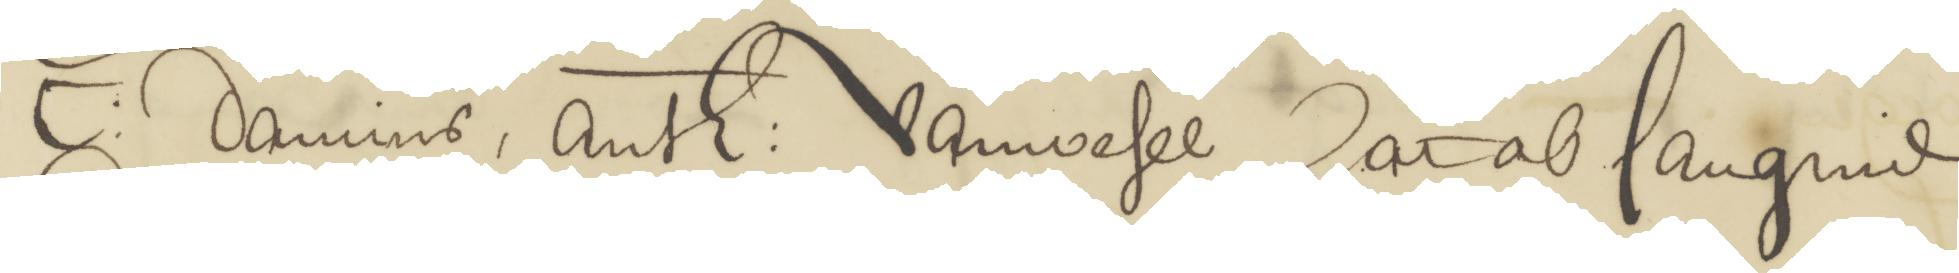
C: damius, anth: van wesel Jacob sangnie
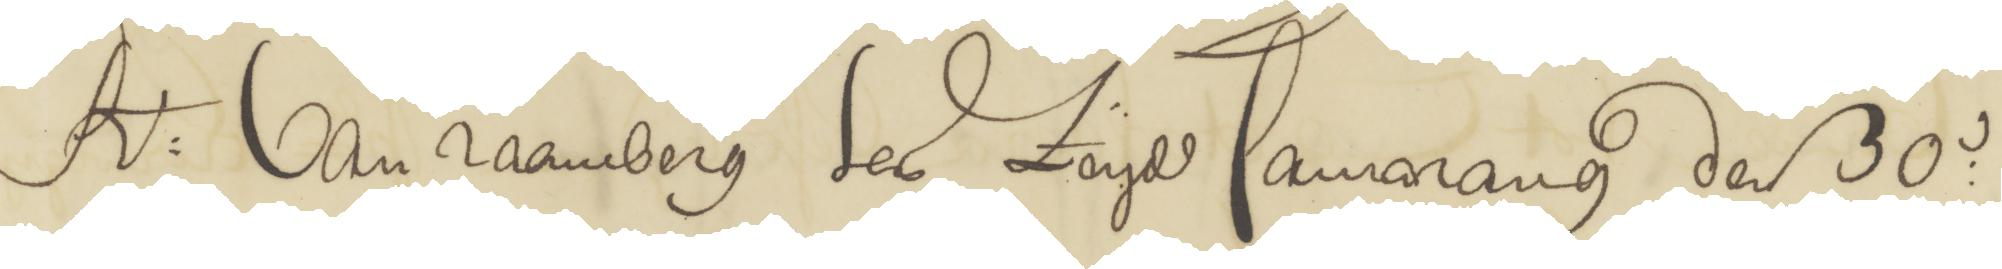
R:t van raamberg ter zeijde samarang den 30:'
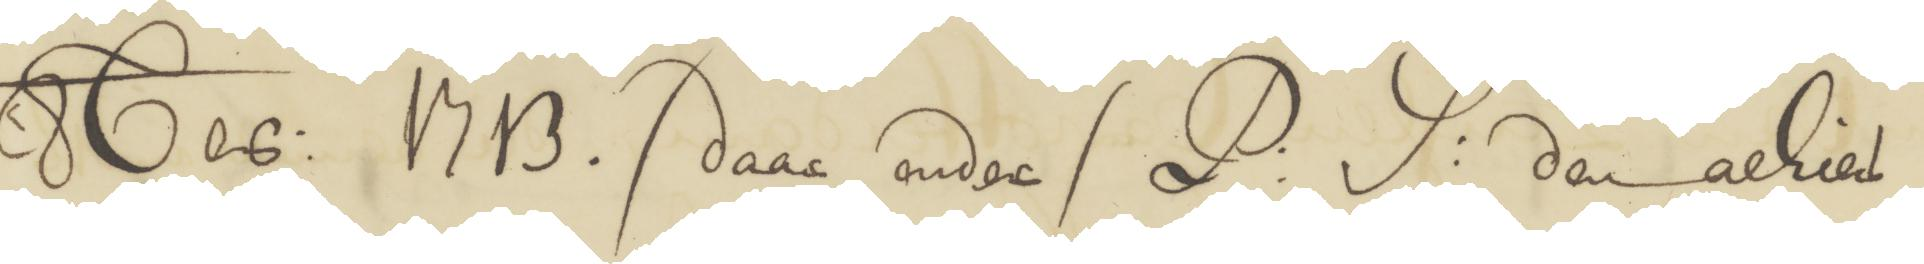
8ber: 1713. /daar onder/ P: S: den alhier
